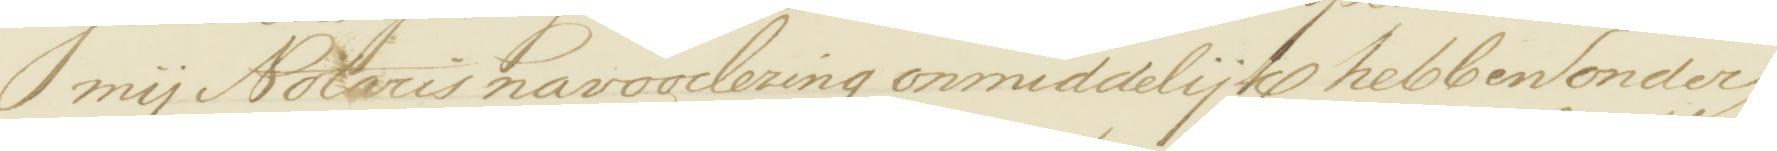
mij Notaris na voorlezing onmiddelijk hebben onder
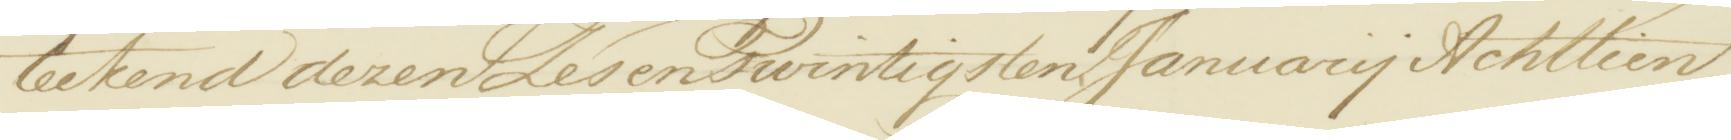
teekend dezen Zes en Twintigsten Januarij Achttien
